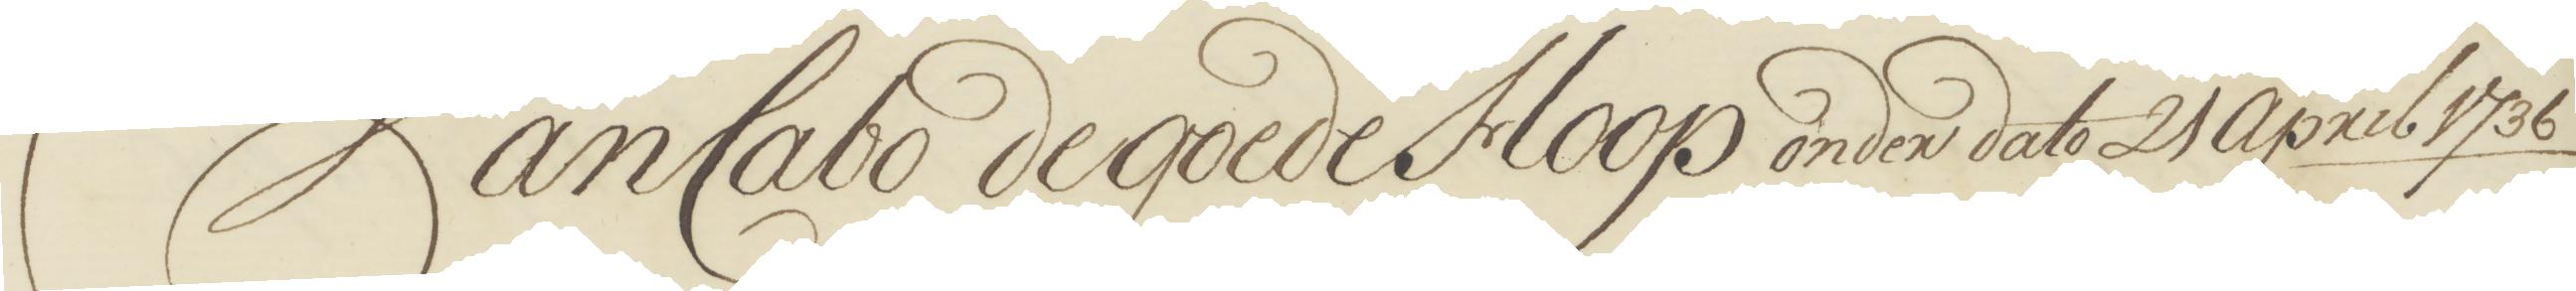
Van Cabo de goede Hoop onder dato 21 april 1736
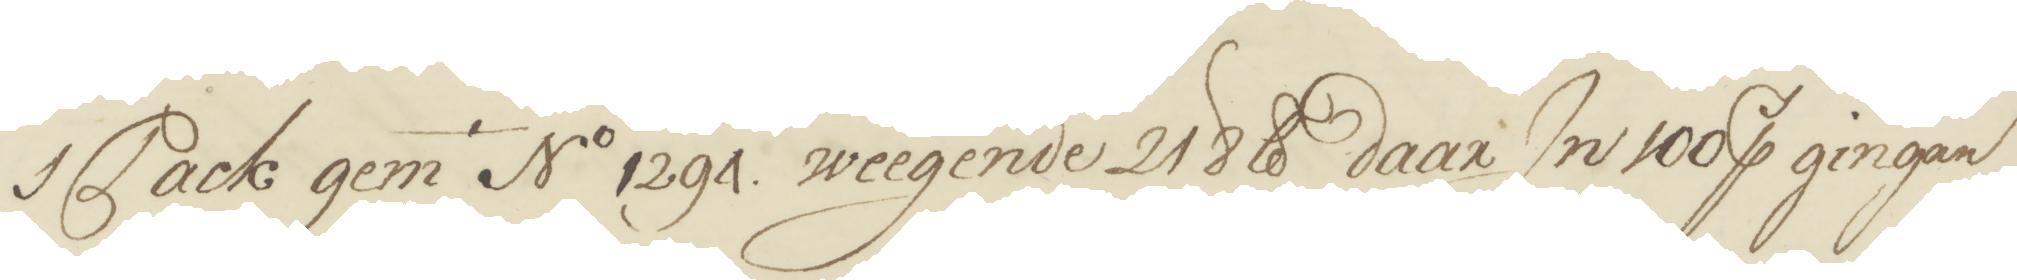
1 Pack gemt N=o 1294. weegende 218 lb daar Jn 100ps gingan
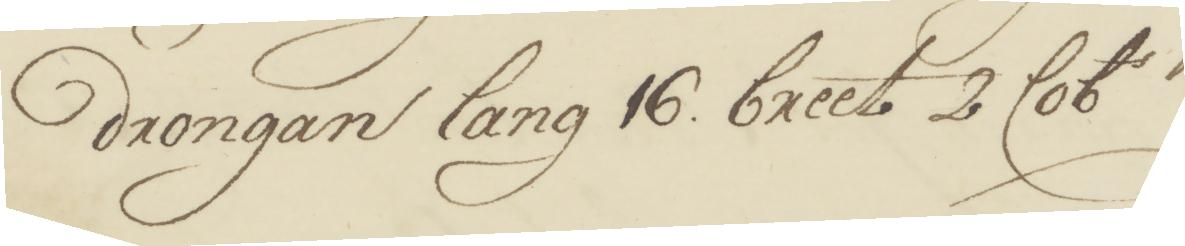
drongan lang 16. breet 2 Cobs
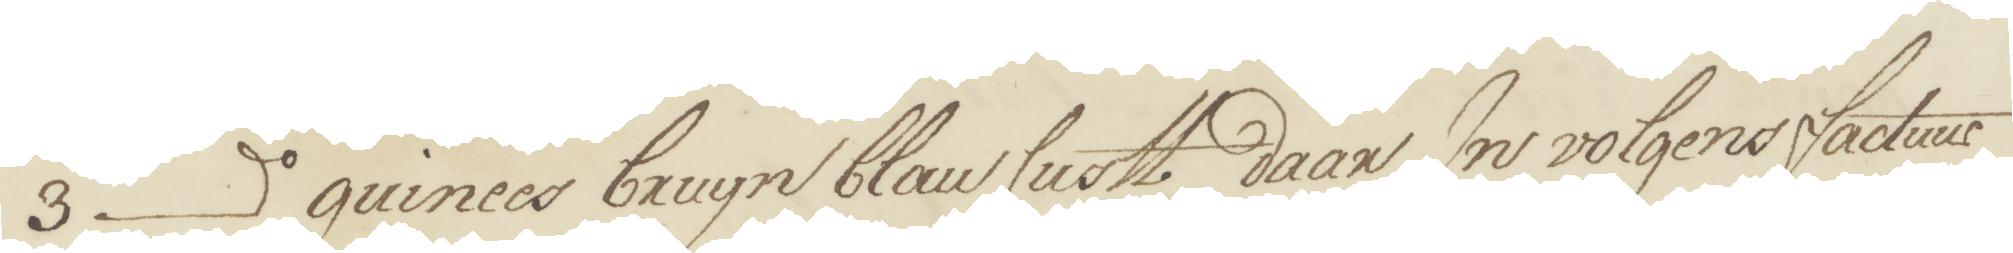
3 _o guinees bruyn blau custt daar Jn volgens factuur
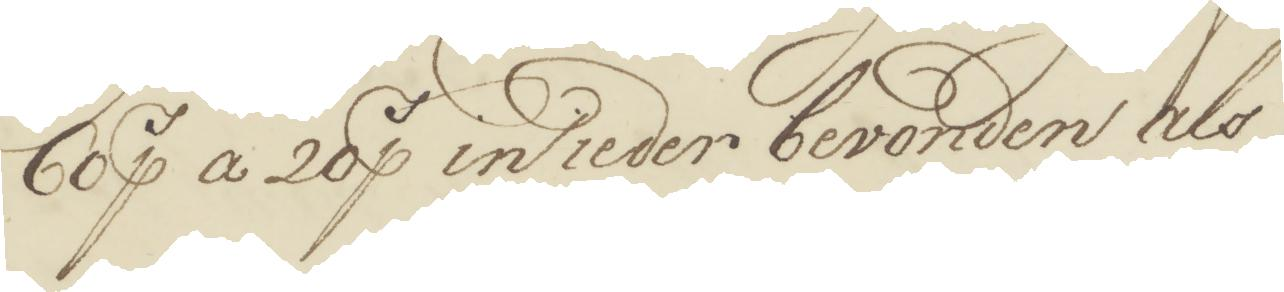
60 ps a 20 ps in ieder bevorden als
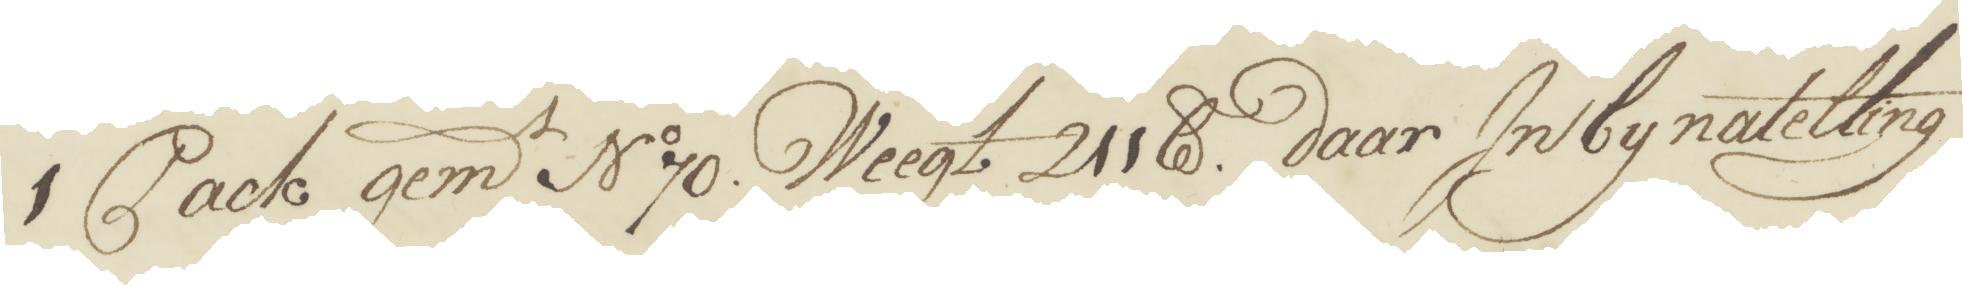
1 Pack gemt No 70. Weegt 211 lb. daar Jn by natelling
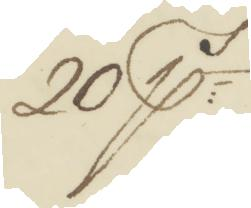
20 p:=s
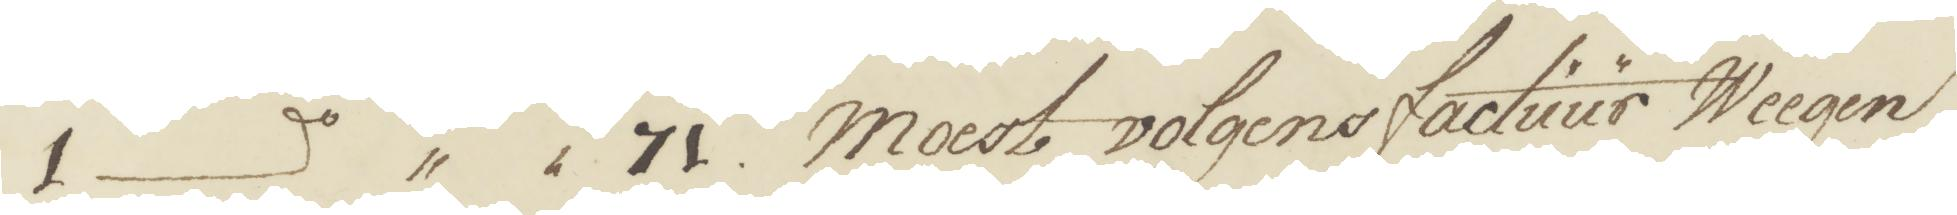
1 _o „ „ 71. moest volgens factuur Weegen
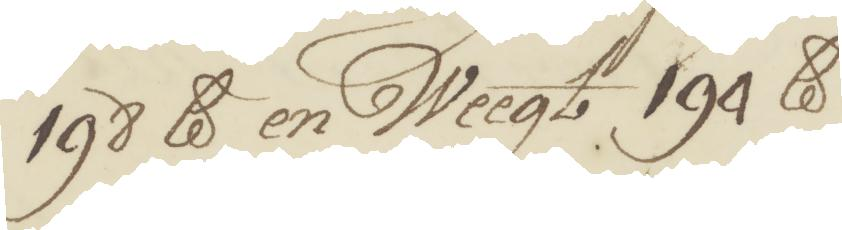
198 lb en Weegt 194 lb
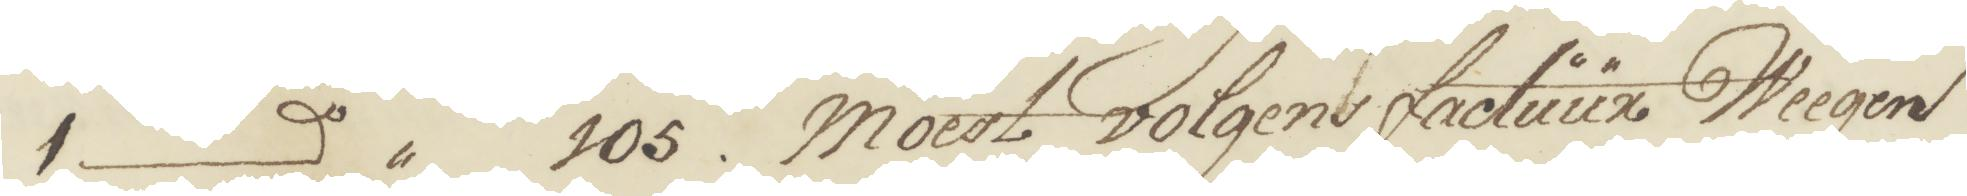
1 _o „ 105. moest volgens factuur Weegen
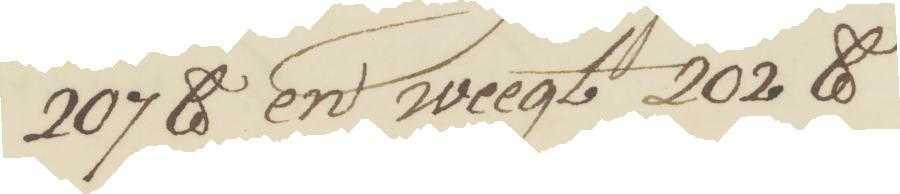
207 lb en weegt 202 lb
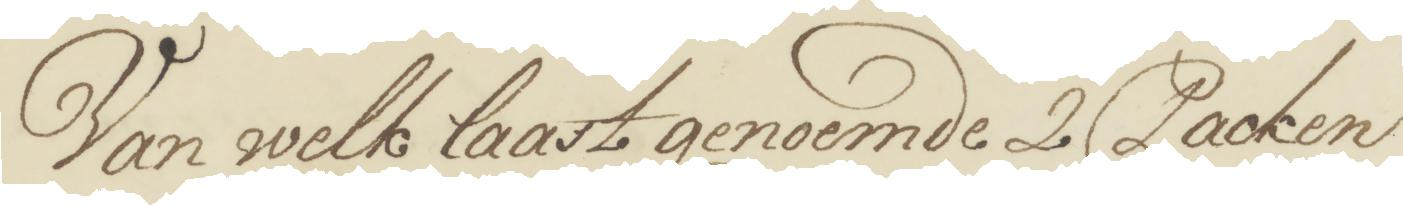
Van welk laast genoemde 2 Packen
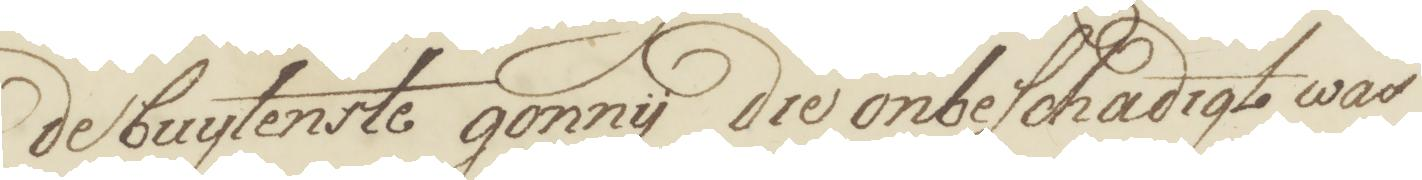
de buytenste gonnij die onbeschadigt was
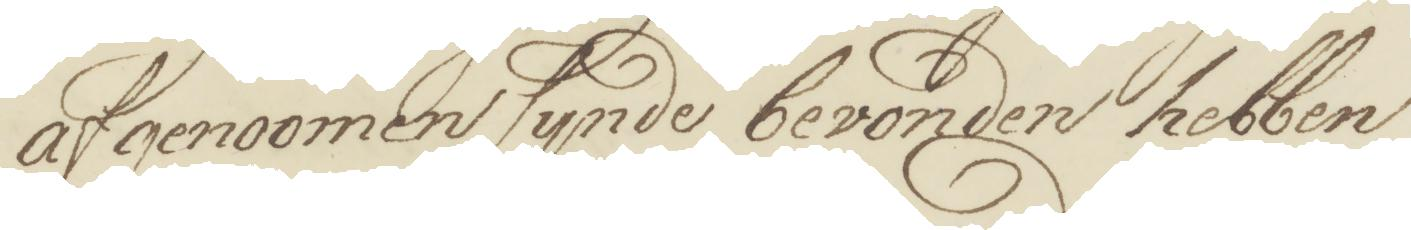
afgenoomen synde bevonden hebben
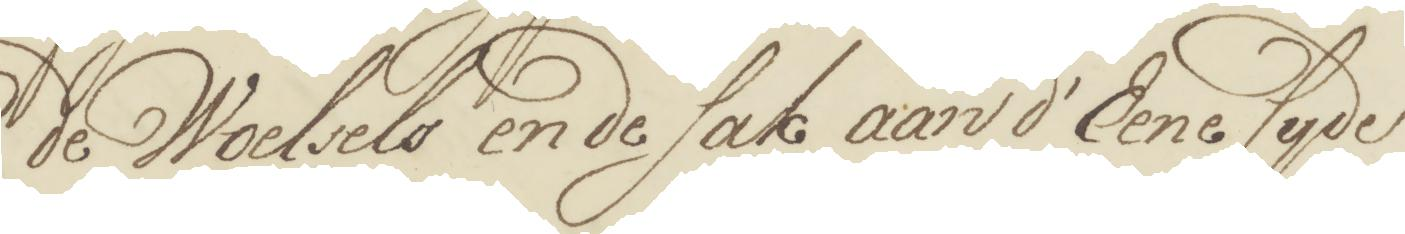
de Woelsels en de sak aan d' Eene syde
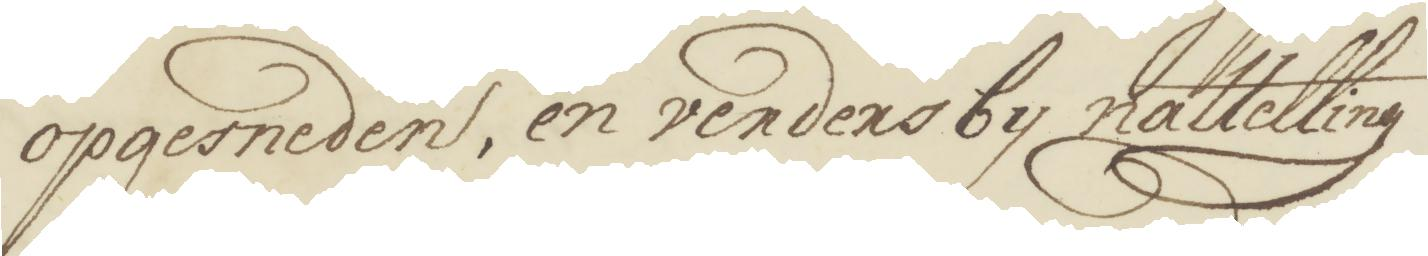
op gesneden, en verders by nattelling
